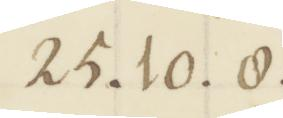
25.10. 8.
